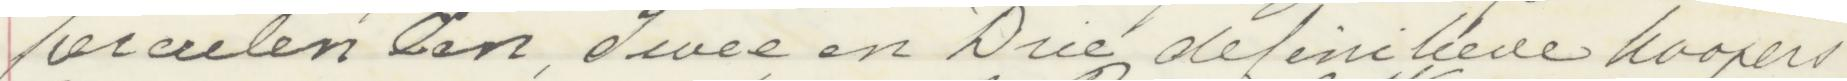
perceelen Een, twee en Drie definitieve koopers
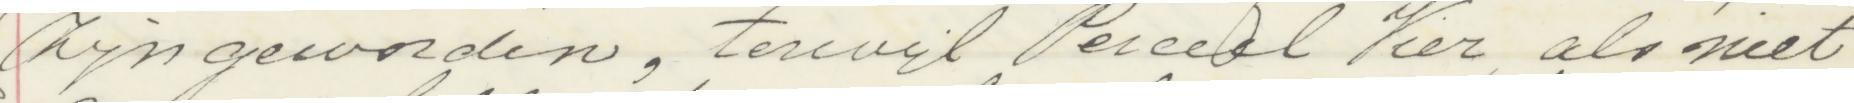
zijn geworden, terwijl Perceel Vier, als niet
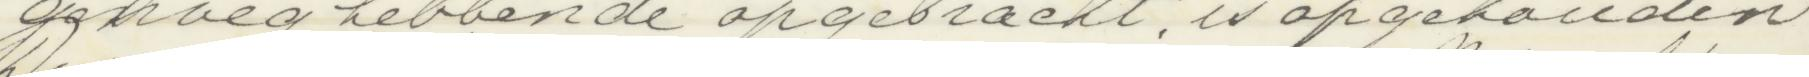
genoeg hebbende opgebracht, is opgehouden
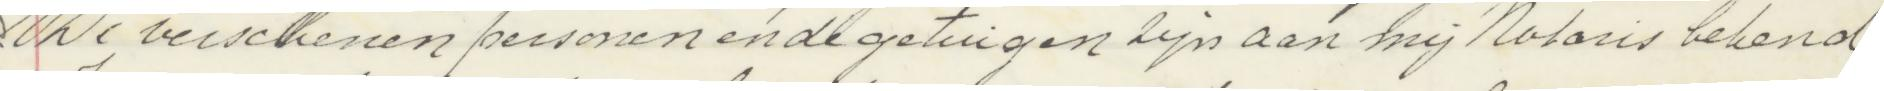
De verschenen personen en de getuigen zijn aan mij Notaris bekend
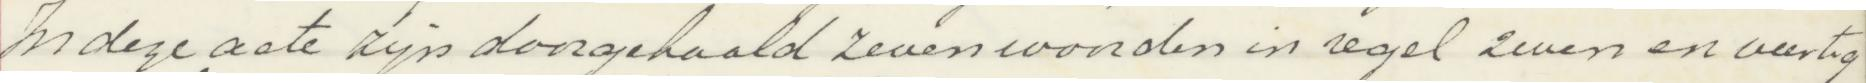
In deze acte zijn doorgehaald zeven woorden in regel zeven en veertig
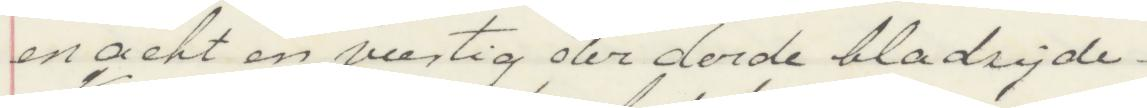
en acht en veertig der derde bladzijde
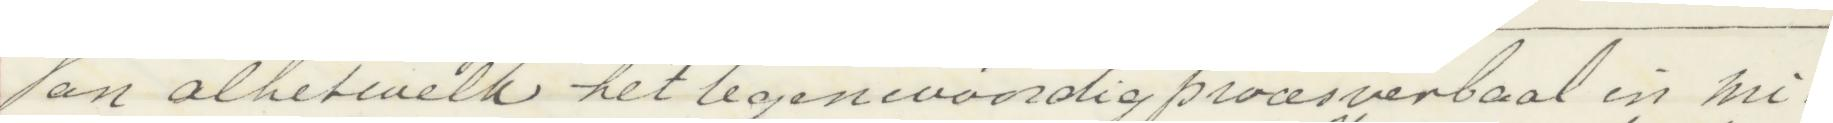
Van al hetwelk het tegenwoordig proces verbaal en mi„
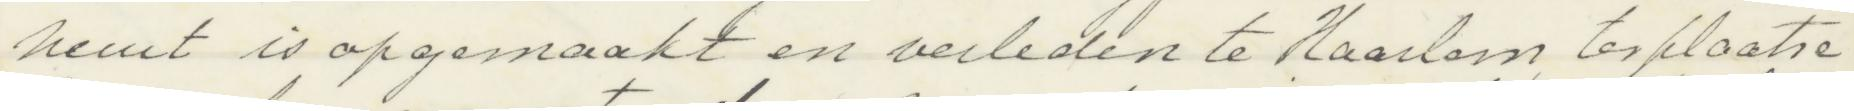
nuut is opgemaakt en verleden te Haarlem, ter plaatse
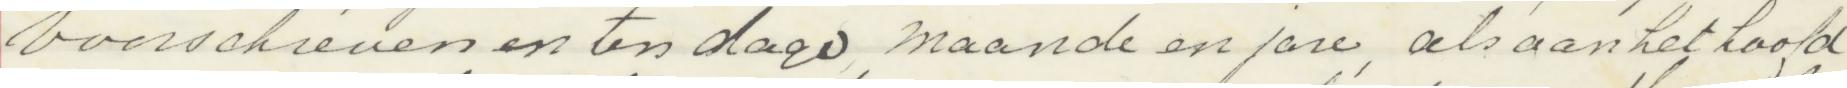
voorschreven en ten dage, maande en jare, als aan het hoofd
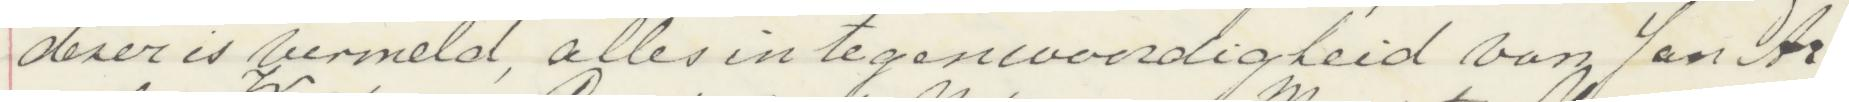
dezer is vermeld, alles in tegenwoordigheid van Jan Ar-
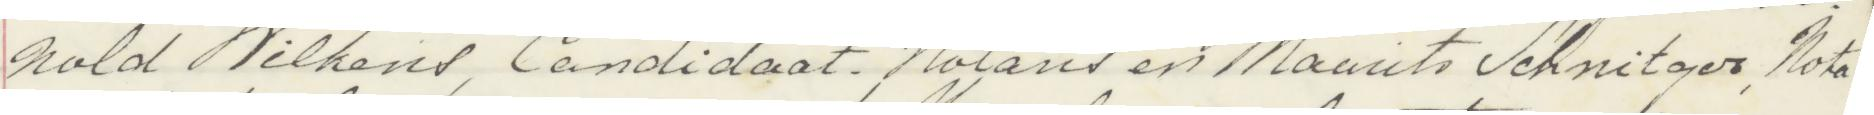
nold Wilkens, Candidaat-Notaris en Maurits Schnitger, Nota
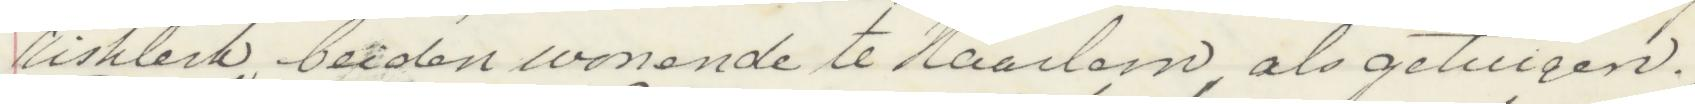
risklerk, beiden wonende te Haarlem, als getuigen.
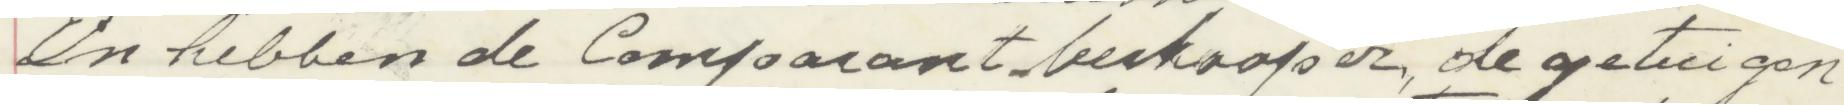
En hebben de Comparant verkooper, de getuigen
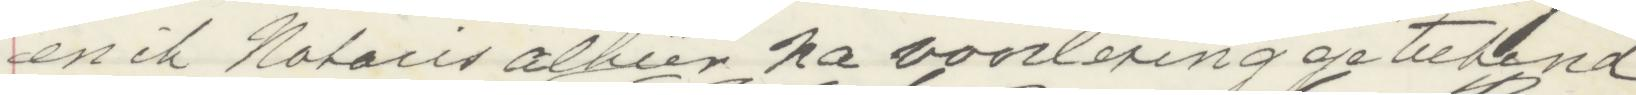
en ik Notaris alhier na voorlezing getekend
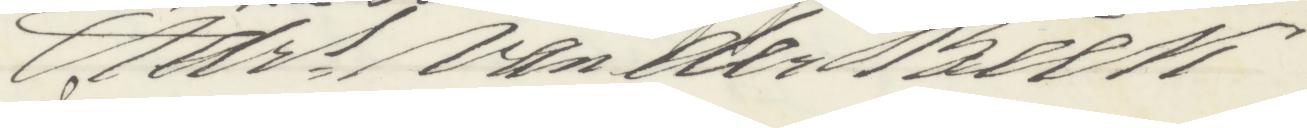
Adr=s van der Beek
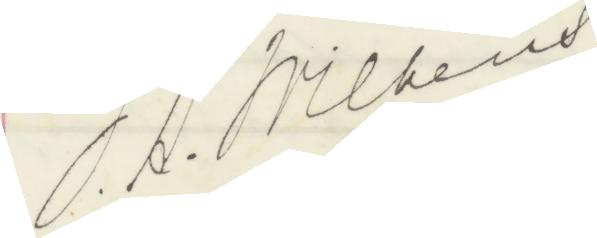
I.A.Wilkens
